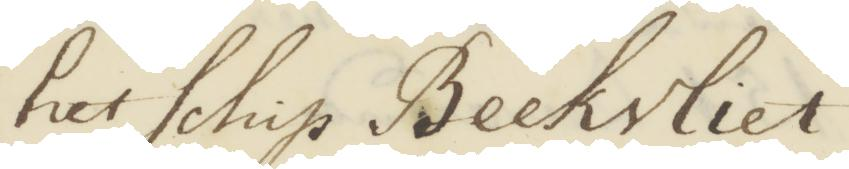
het schip Beekvliet
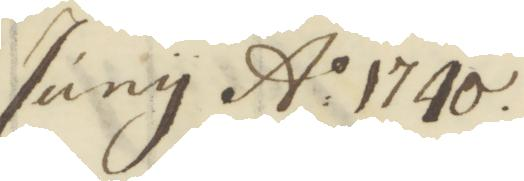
Junij A:o 1740.
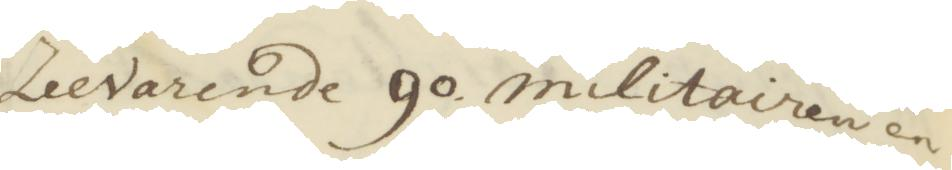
Zeevarende 90 militairen en
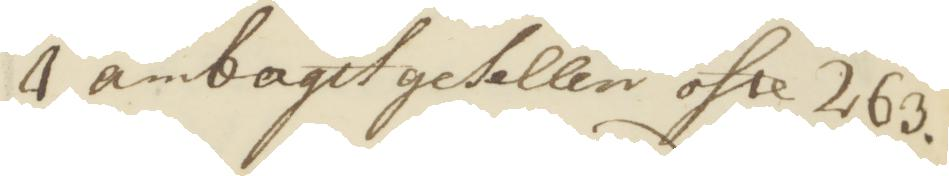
4 ambagts gesellen ofte 263.
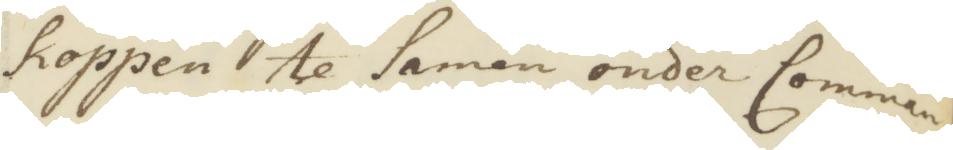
koppen te samen onder comman„
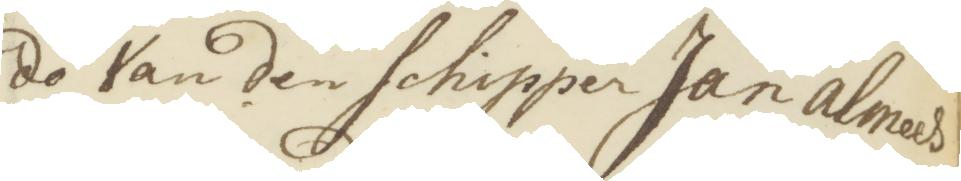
do van den schipper Jan almees
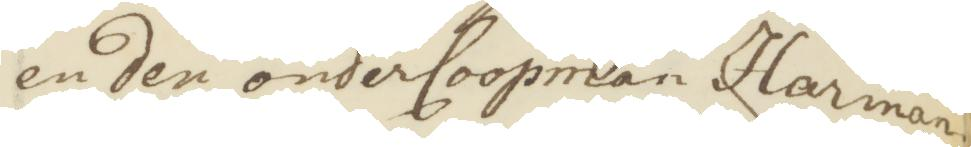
en den onderCoopman Harman
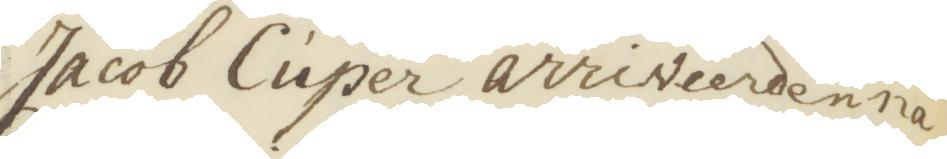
Jacob Cuper arriveerden na
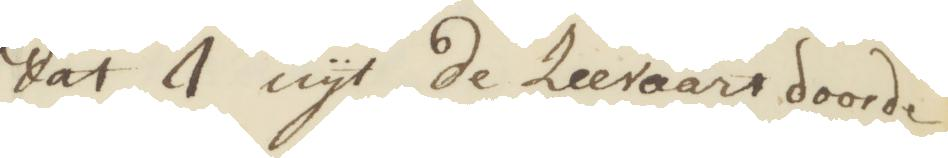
dat 4 uijt de zeevaart door de
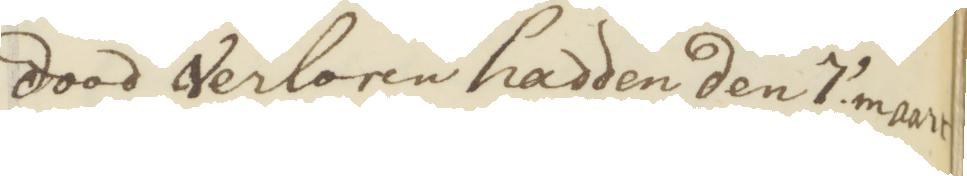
dood verloren hadden den 7.' maart
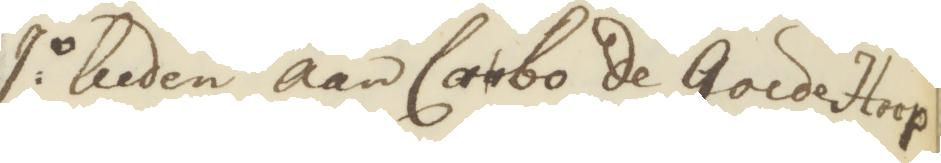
J:o leeden aan Carbo de Goede Hoop
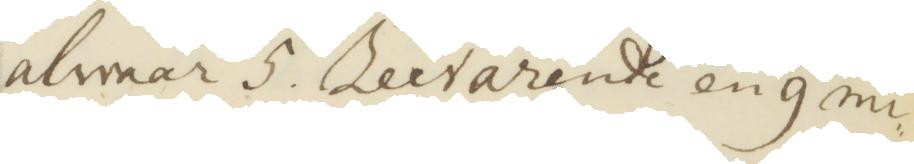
alwaar 5. Zeevarende en 9 mi„
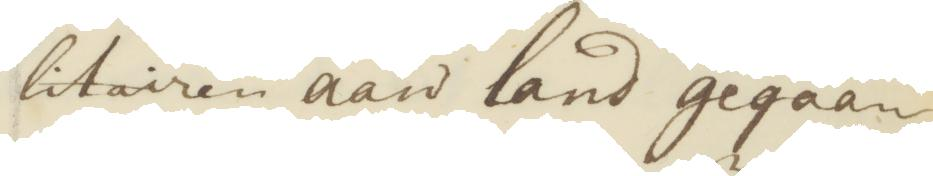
litairen aan land gegaan
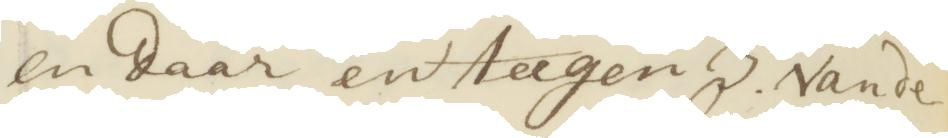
en daar en teegen 3. van de
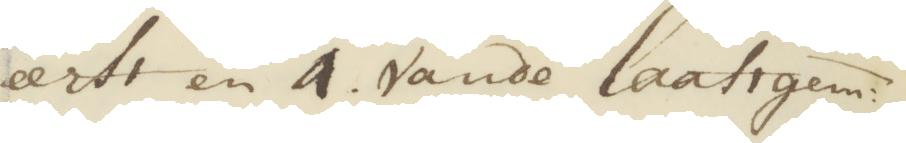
eerst en 4. vande laastgem: —
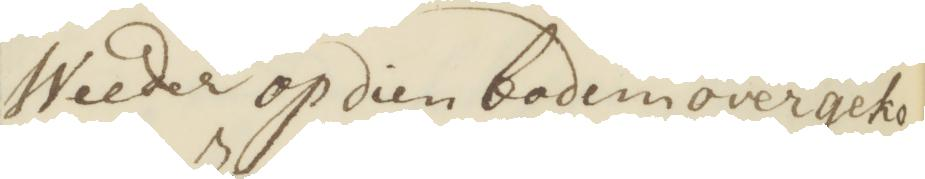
Weeder op dien bodem overgeko
